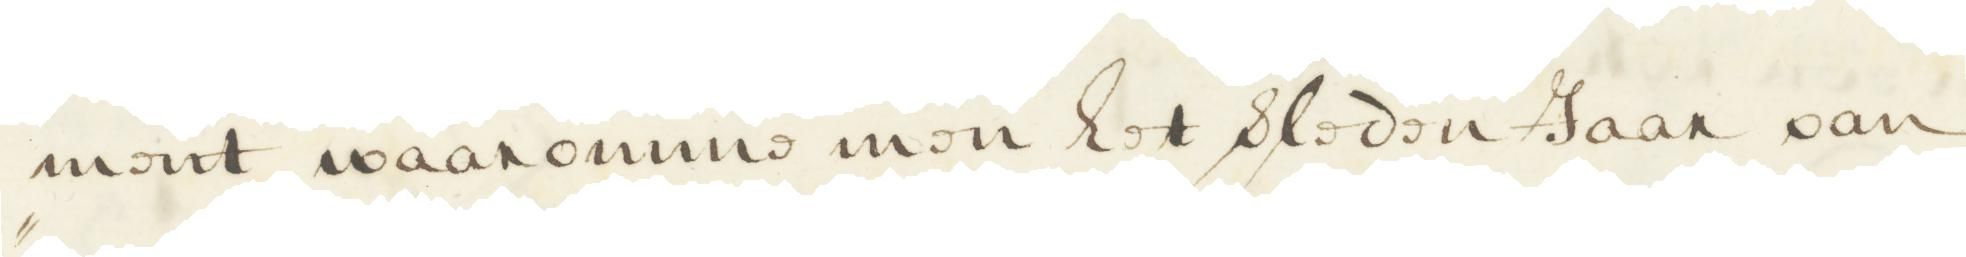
„ment, waar omme men het verleden Iaar van
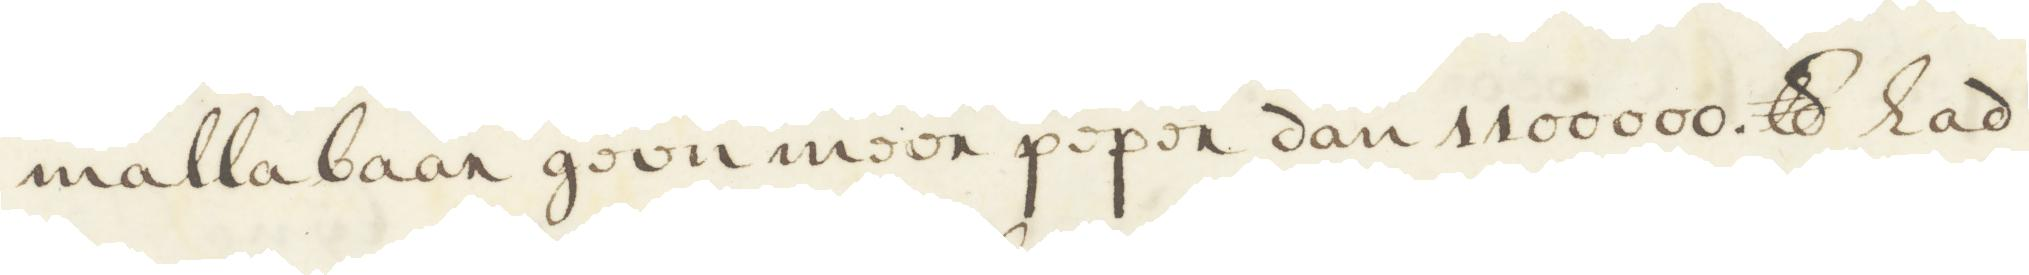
mallabaar geen meer peper dan 1100000. lb had
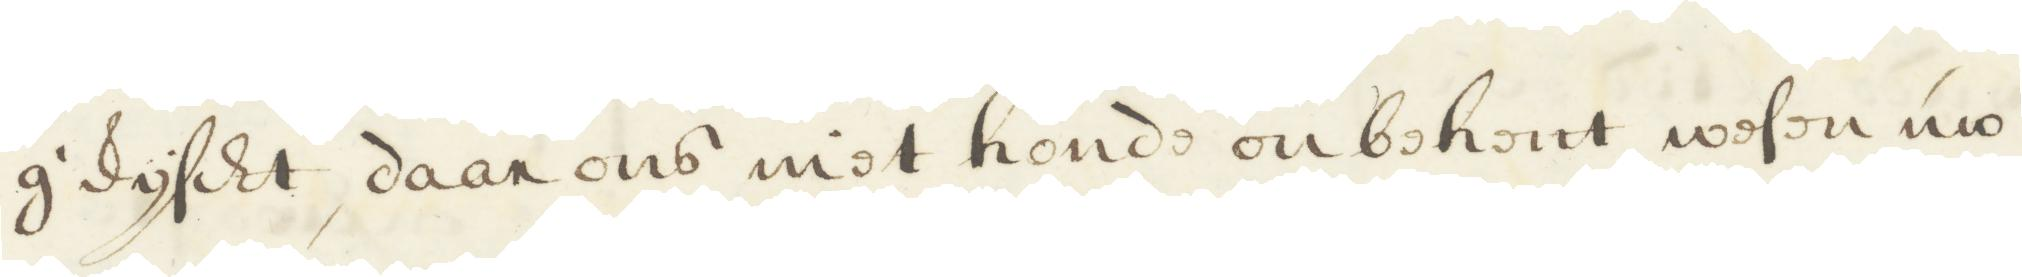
g’Eijscht, daar ons niet konde onbekent wesen uw
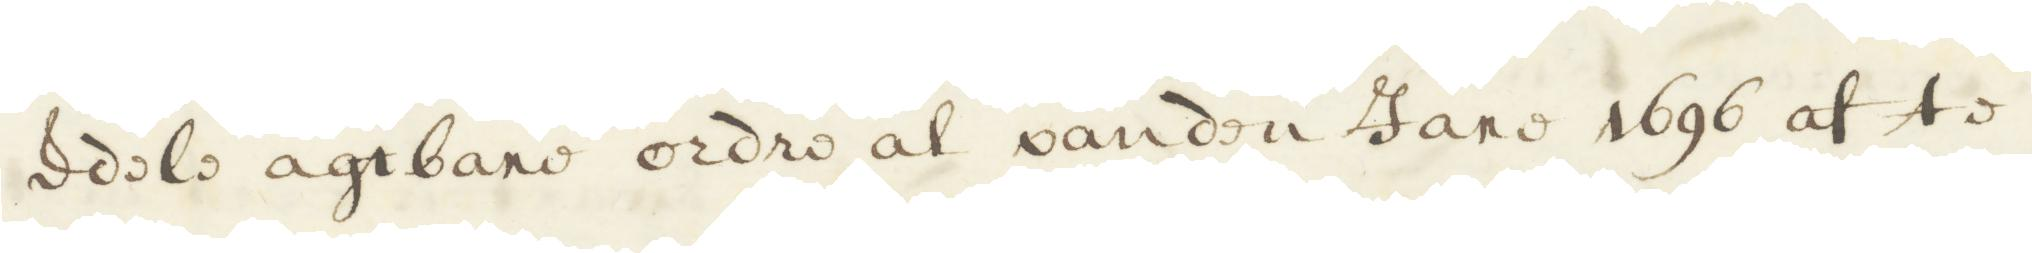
Edele agtbare ordre al van den Iare 1696 af te
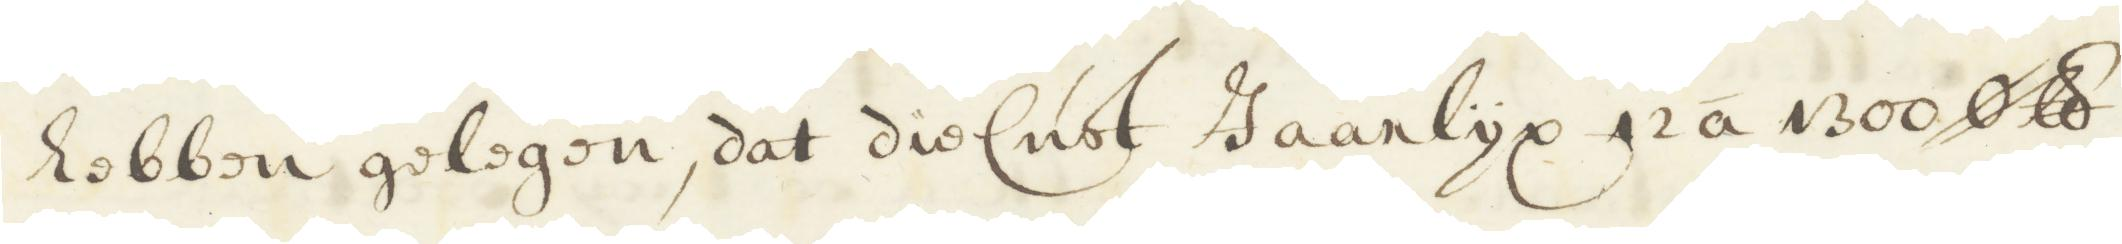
hebben gelegen, dat die Cust Jaarlijx 2 a 1300 O lb
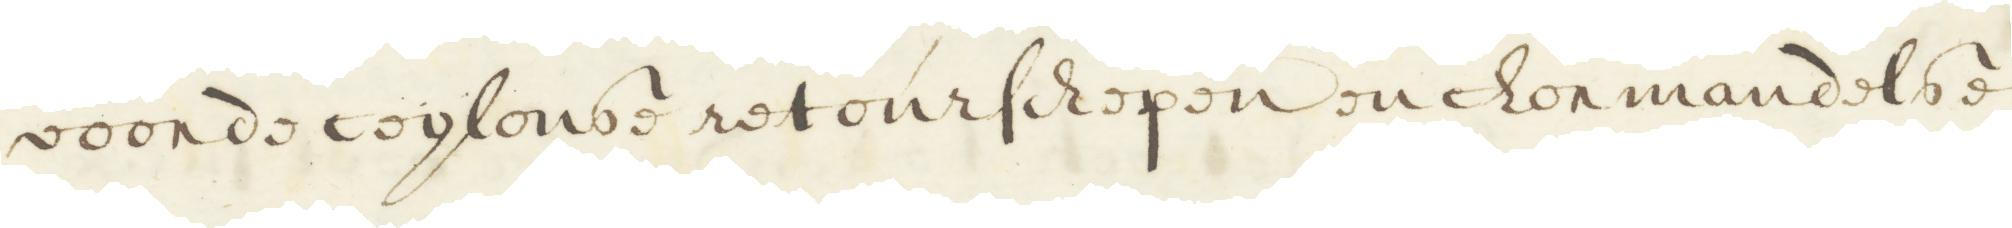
voor de ceijlonse retourschepen en chormandelse
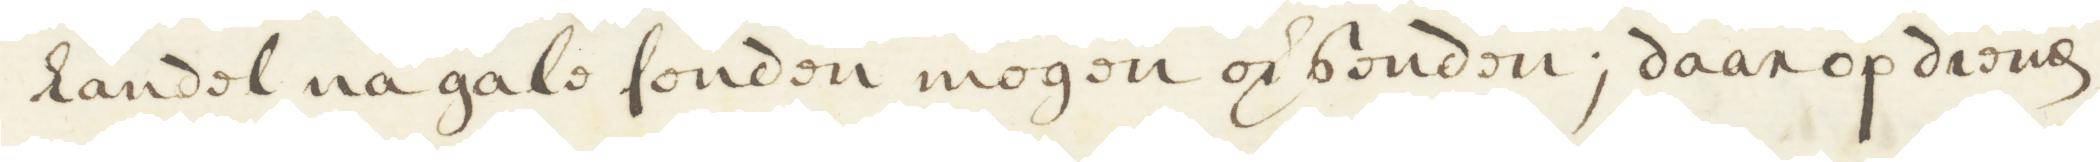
handel na gale souden mogen oversenden; daar op dienen
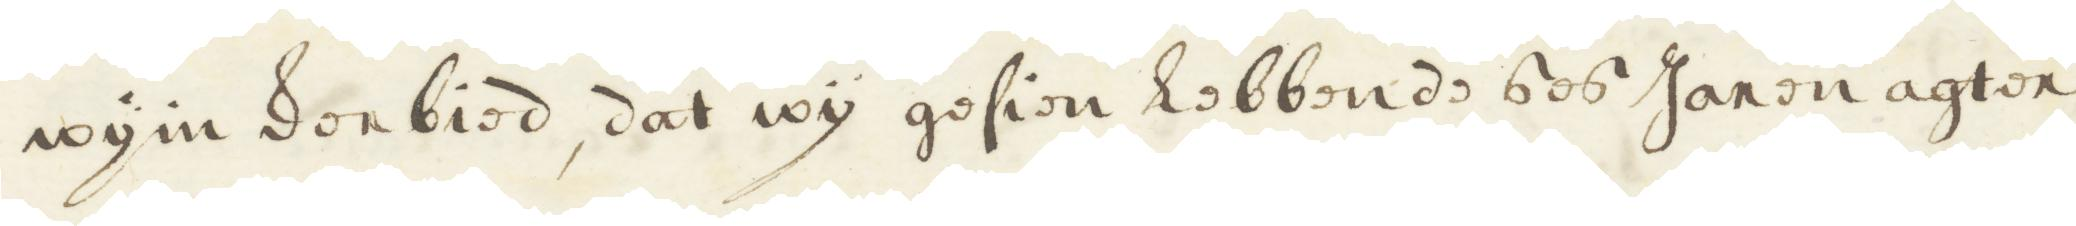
wij in Eerbied, dat wij gesien hebbende ses Jaren agter
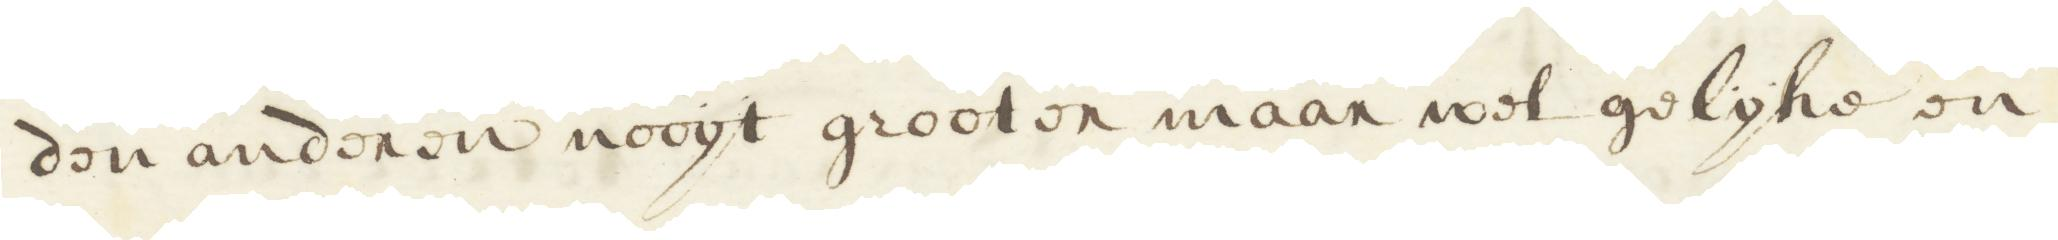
den anderen nooijt grooter, maar wel gelijke en
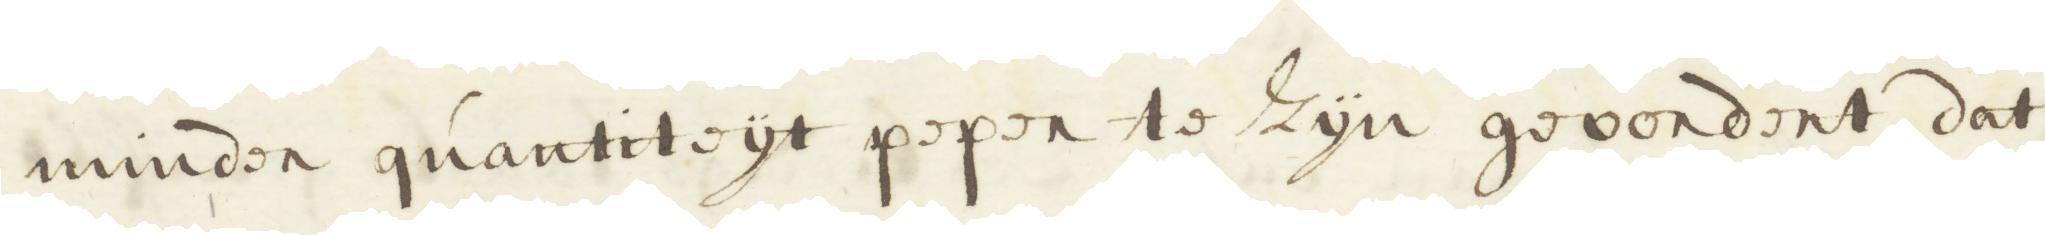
minder quantiteijt peper te zijn gevordert, dat
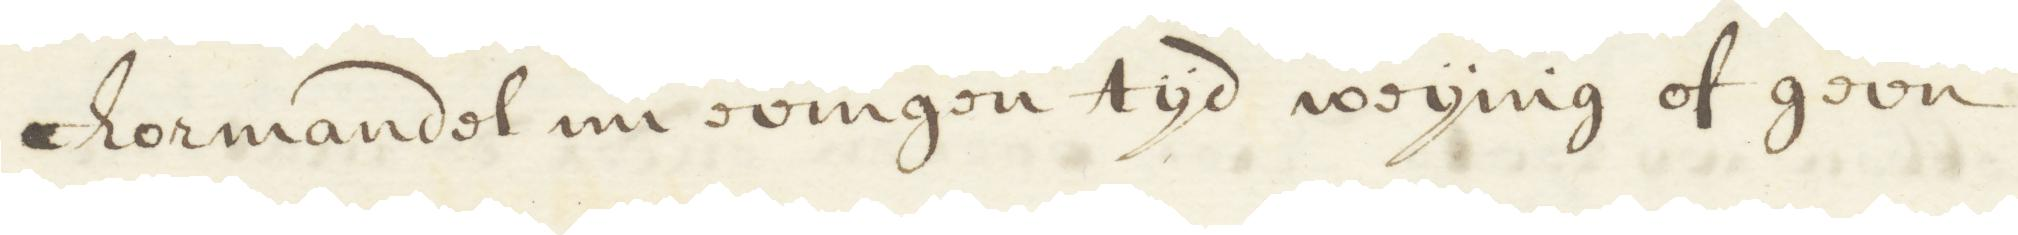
chormandel nu eenigen tijd weijnig of geen
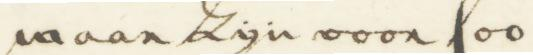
waar zijn voor soo
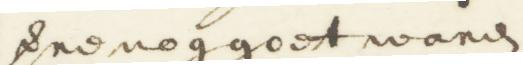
verre nog goet waren
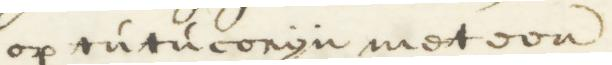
op tutucorijn met een
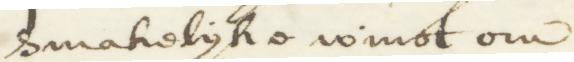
smakelijke winst om
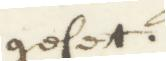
geset.
